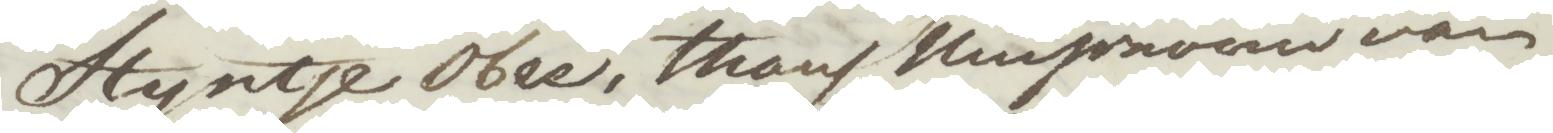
Styntje Obee, thans Huisvrouw van
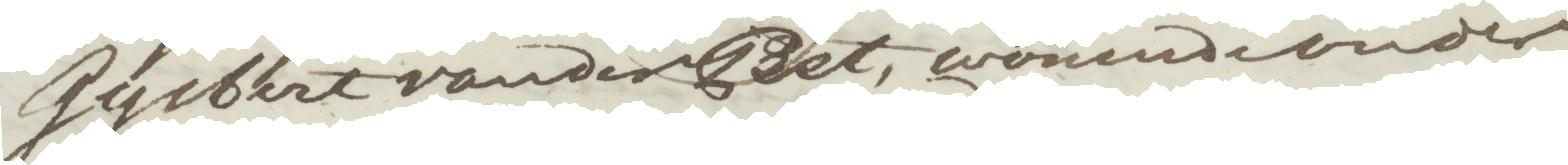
Gysbert van der Bet, wonende onder
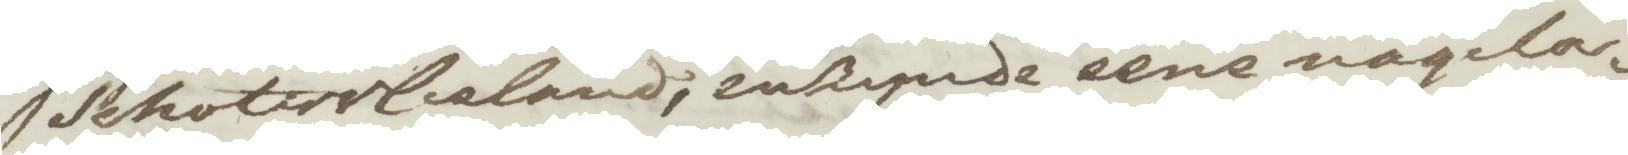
Schotervlieland, en zynde eene nagela
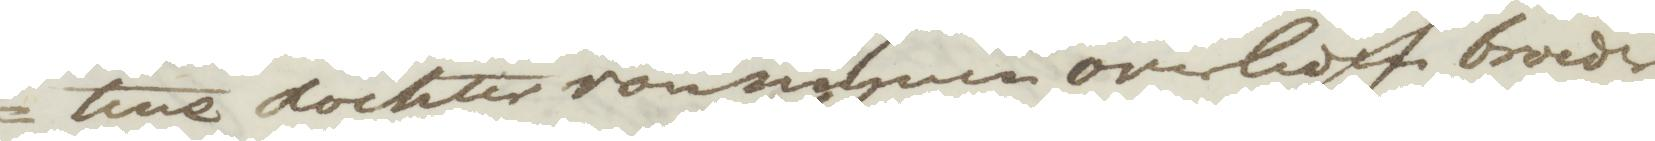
=tene dochter van mynen overleden broeder
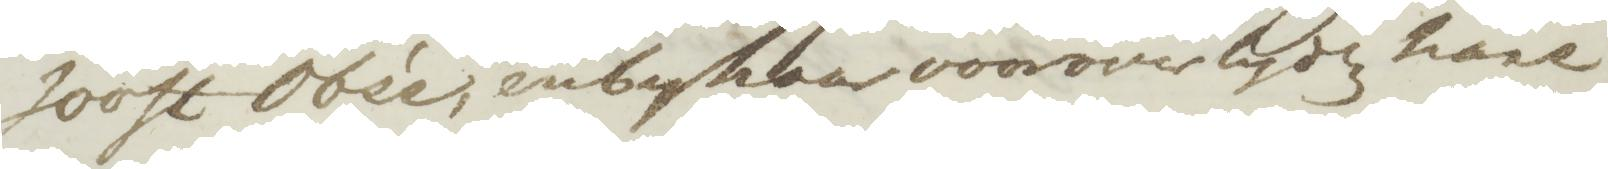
Joost Obée, en by haar vooroverlyden hare
